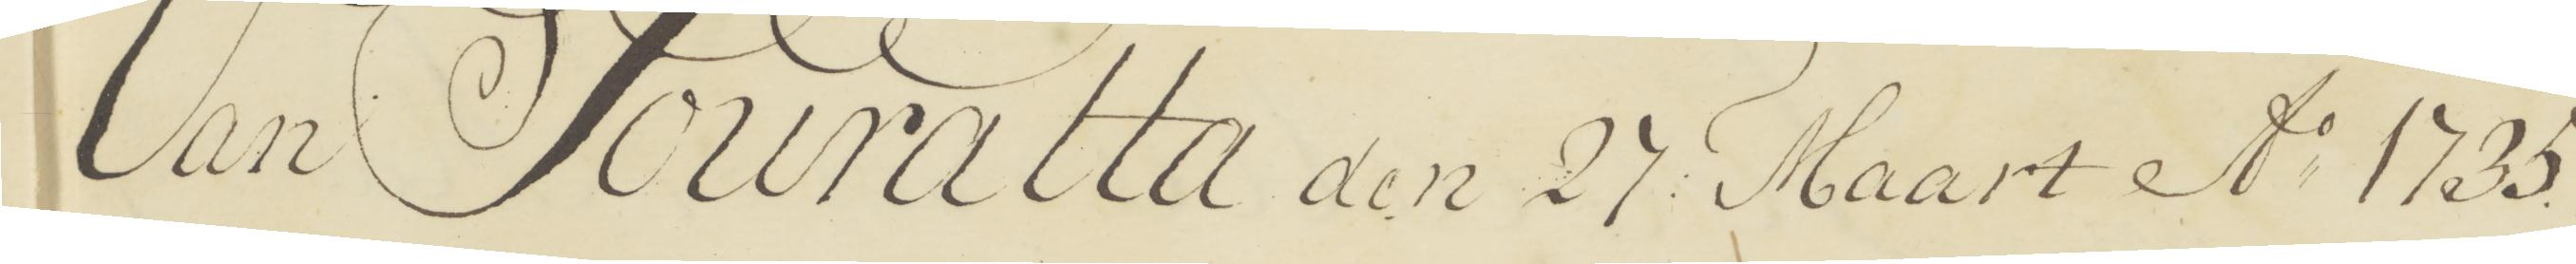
Van Souratta den 27:' Maart A„o 1735.
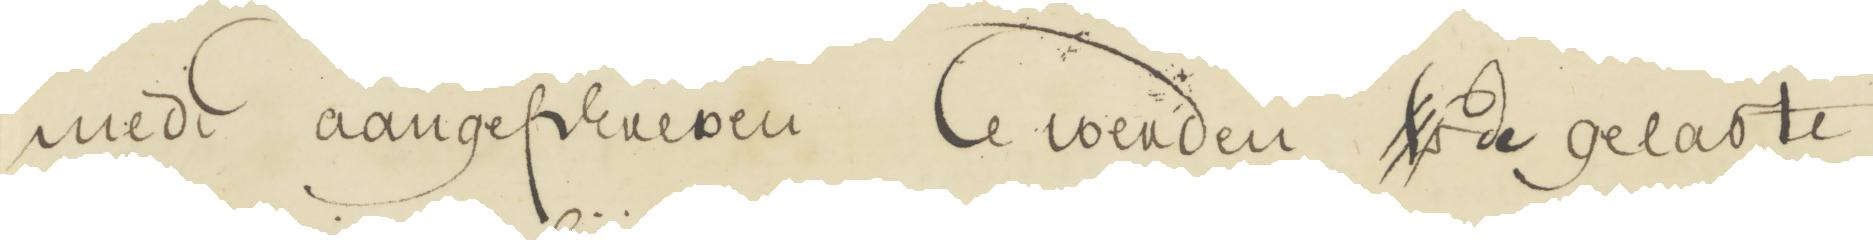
mede aangeschreven te werden te de gelaste
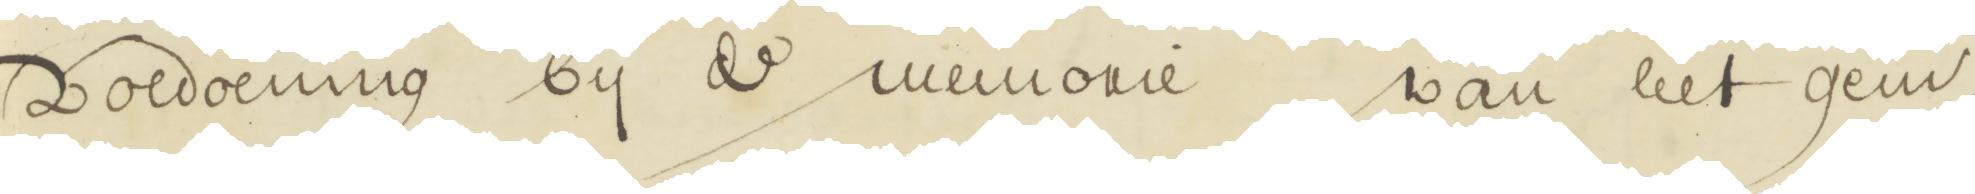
voldoening bij de memorie van het gene
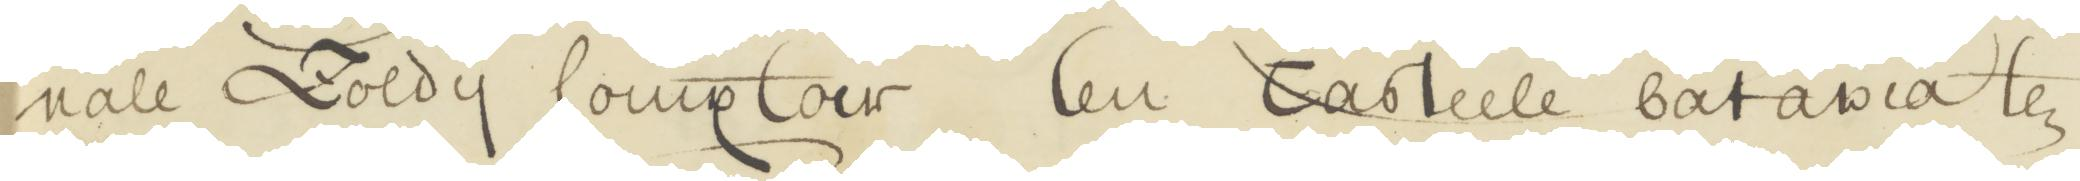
rale Zoldij Comptoir ten Casteele batavia ten
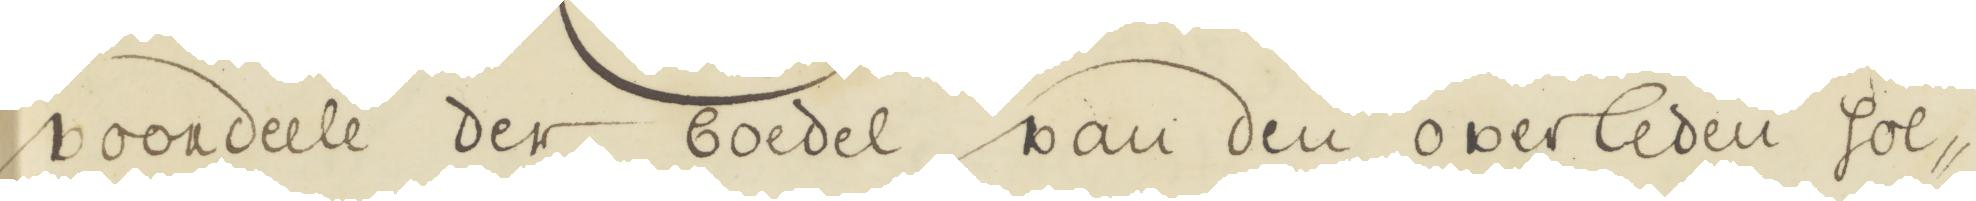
voordeele der boedel van den overleden sol„
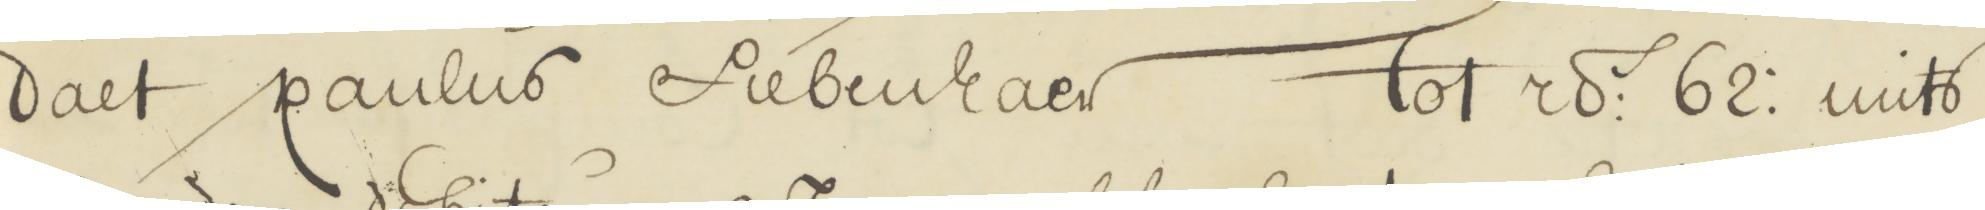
daet paulus Fiebenhaer tot rd:s 62: mits
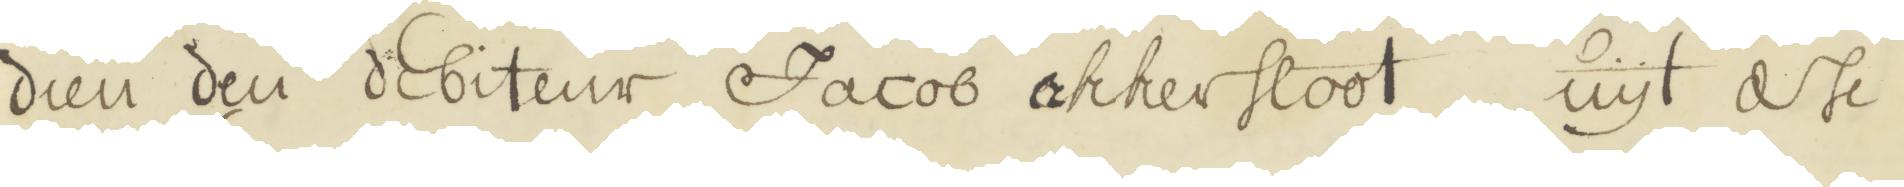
dien den debiteur Iacob akkersloot uijt dese
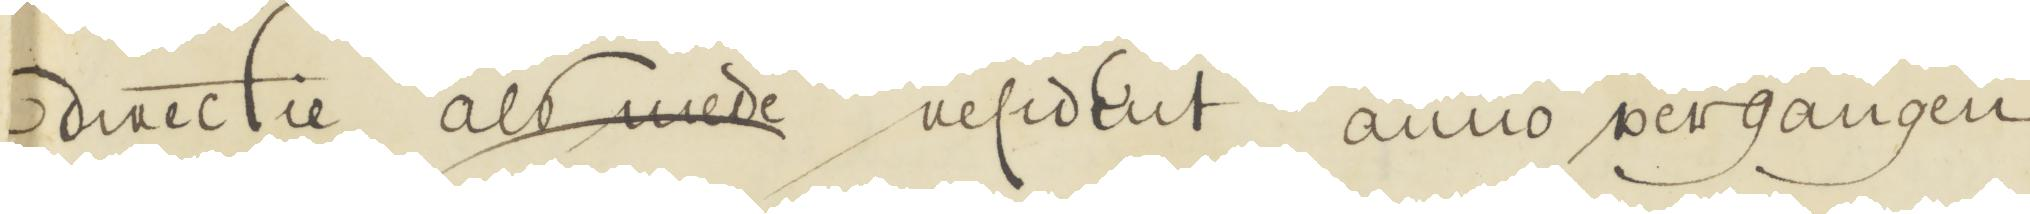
directie als mede resident anno vergangen
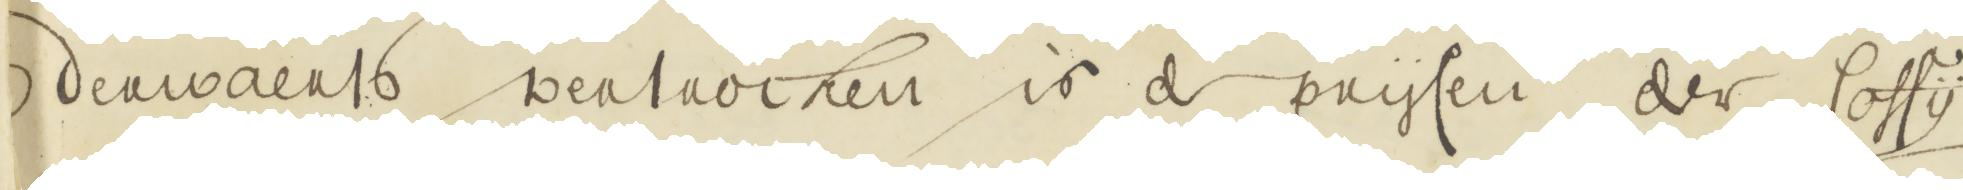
derwaerts vertrocken is de prijsen der Coffij
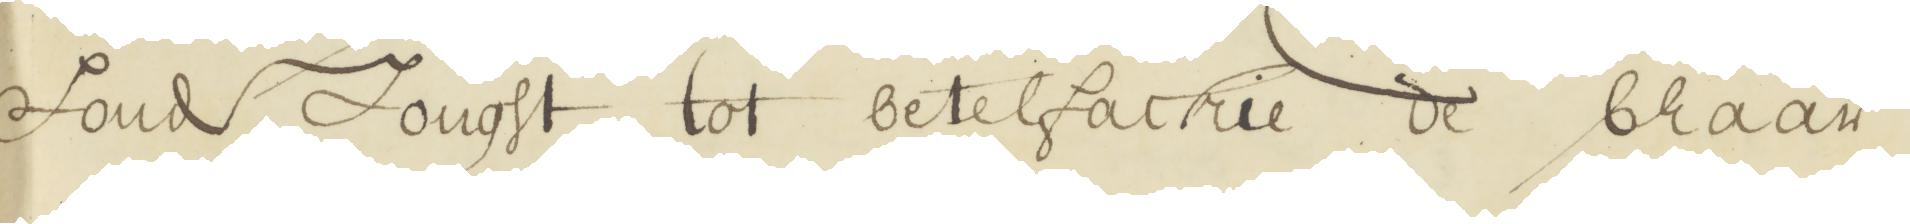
soude Iongst tot betelfackie de bhaar
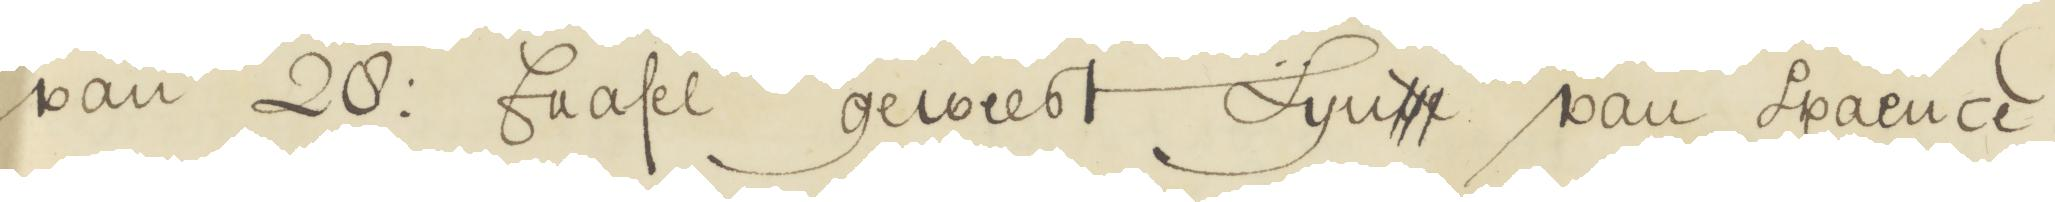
van 28. frasel geweest sijnde van spaence
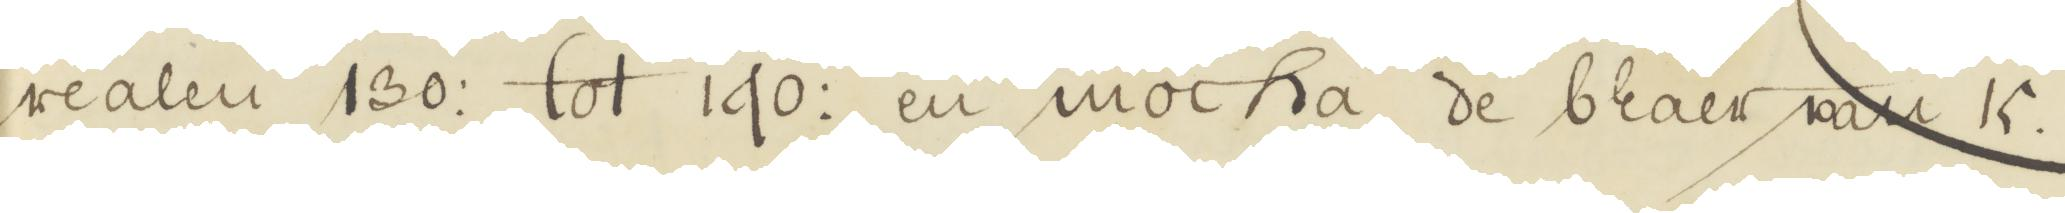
realen 130: tot 140: en mocha de bhaer van 15.
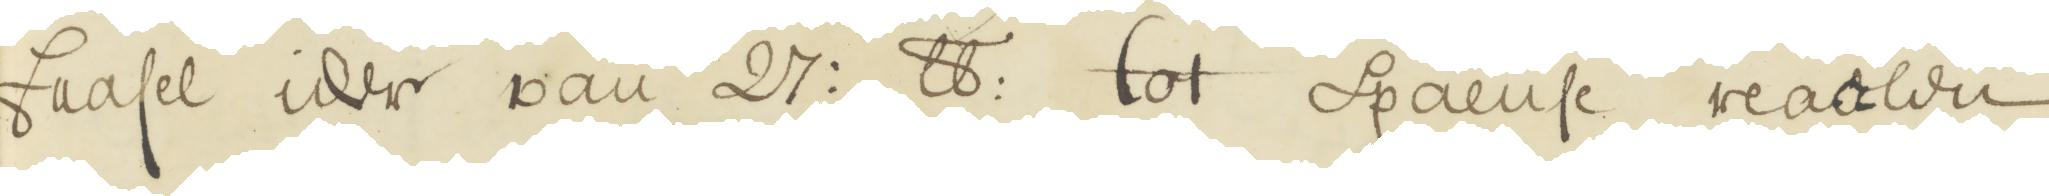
frasel ider van 27: lb: tot spaense reaalen
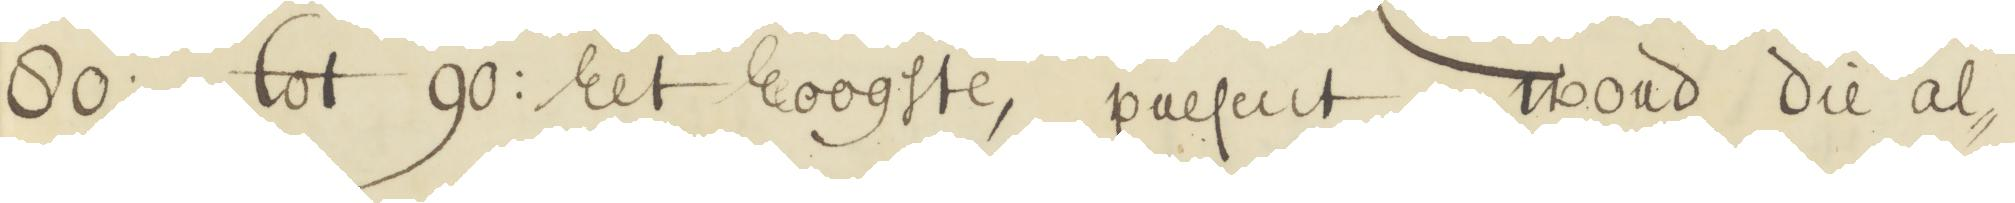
80: tot 90: het hoogste, present word die al„
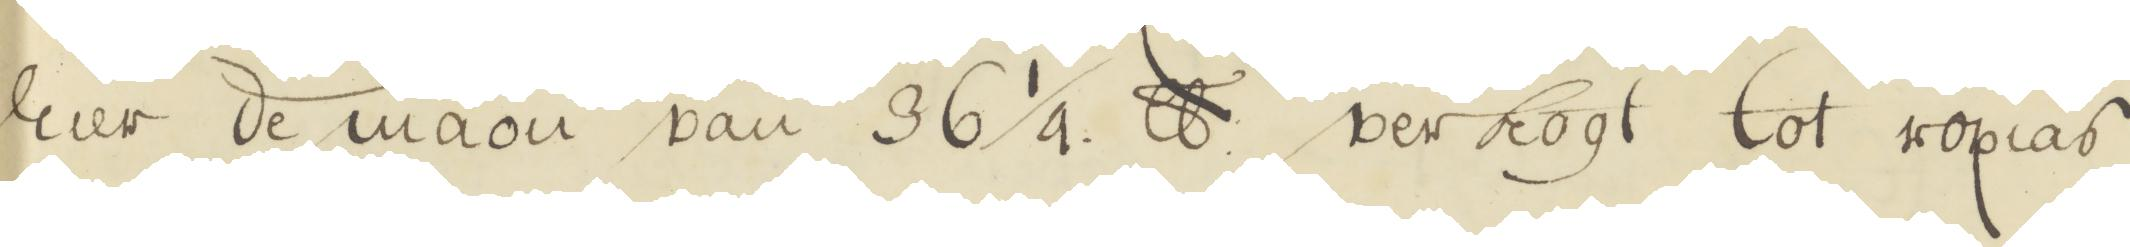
hier de maon van 36¼. lb: verkogt tot ropias
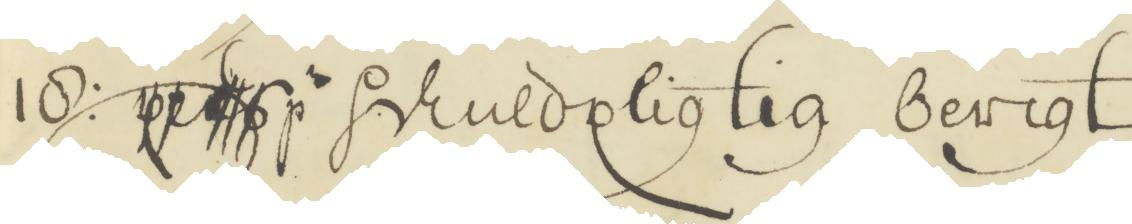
18: pres p„r schuldpligtig berigt
